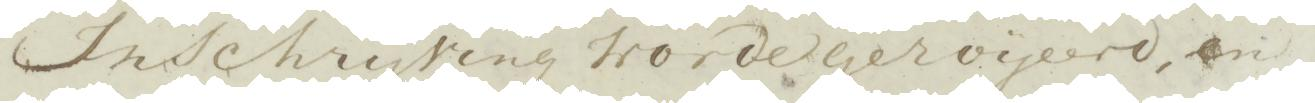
Inschrijving worde geroijeerd, en
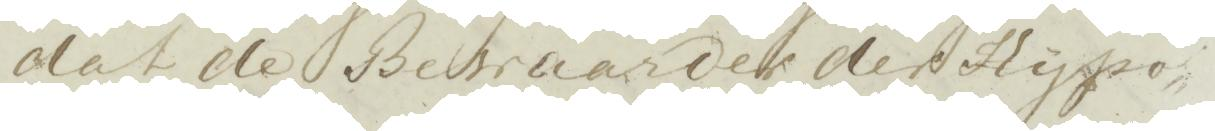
dat de Bewaarder der Hijpo„
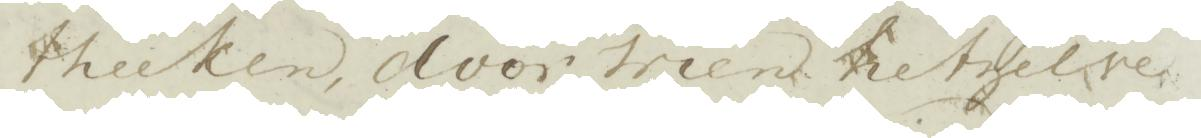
theeken, door wien hetzelve
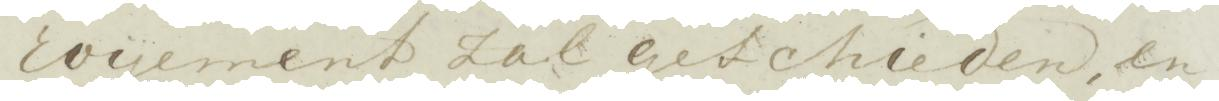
roijement zal geschieden, en
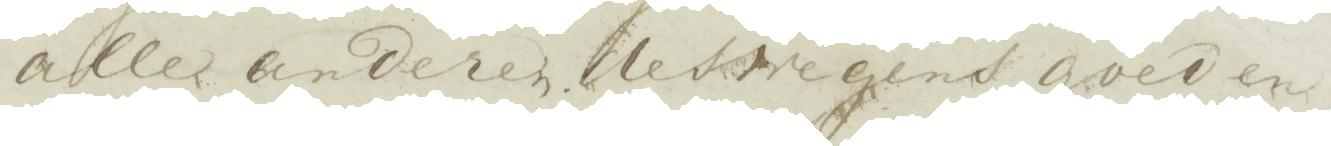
alle anderen deswegens goed en
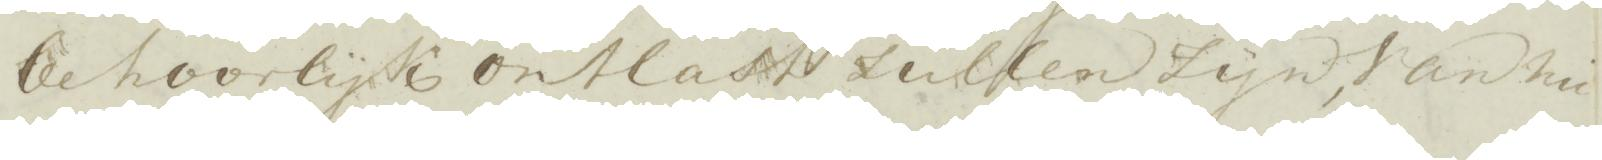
behoorlijk ontlast zullen zijn, van nu
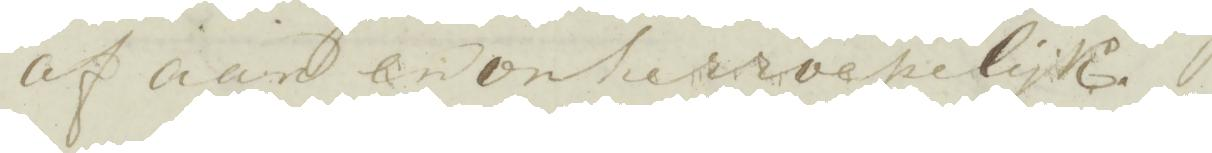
af aan en onherroepelijk.
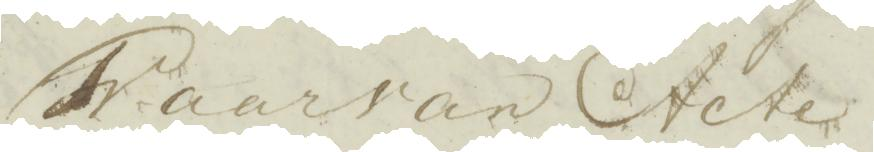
Waarvan Acte:
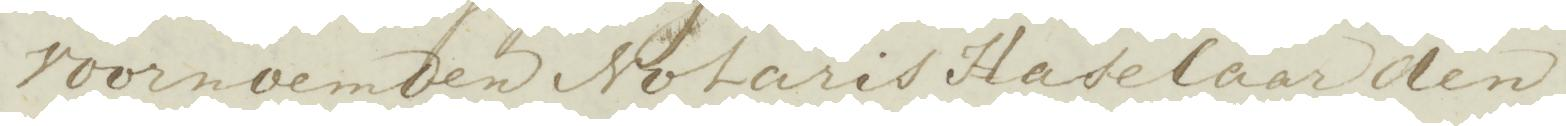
voornoemden Notaris Haselaar den
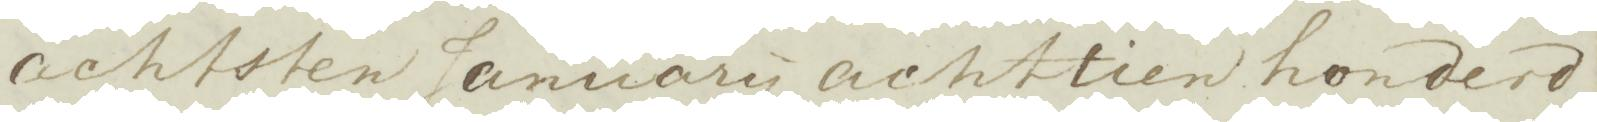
achtsten Januarij achttien honderd
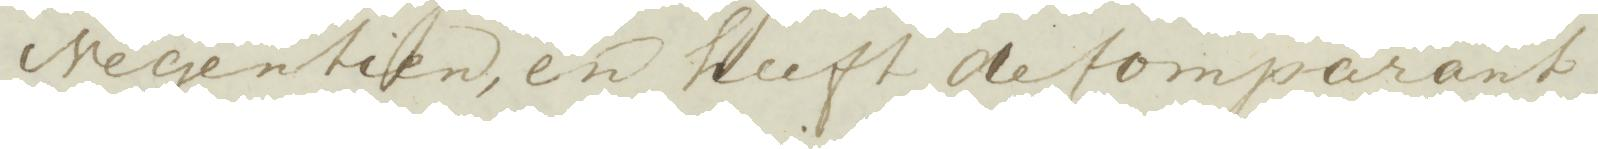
Negentien, en heeft de comparant
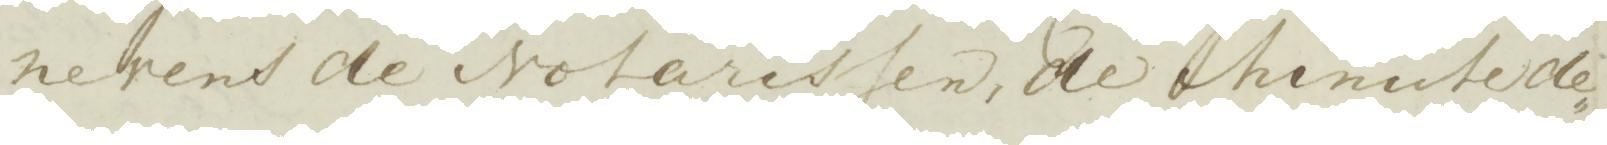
nevens de Notarissen, de Minute de„
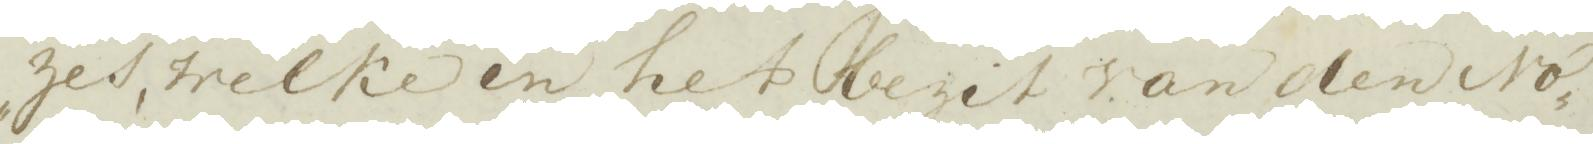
„zes, welke in het bezit van den No„
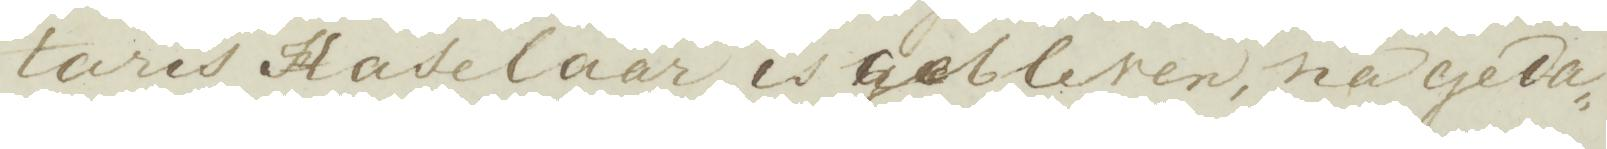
taris Haselaar is gebleven, na geda„
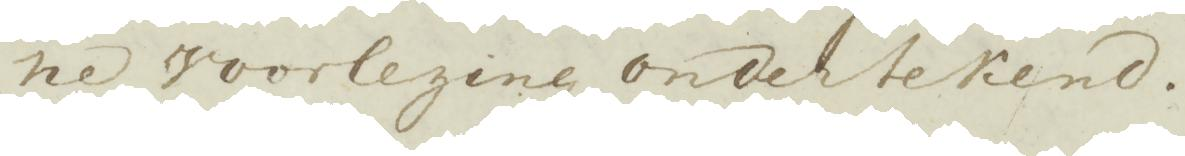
ne voorlezing ondertekend.
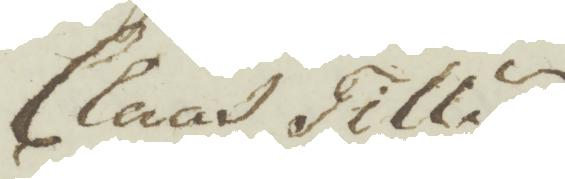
Claas Tilly
